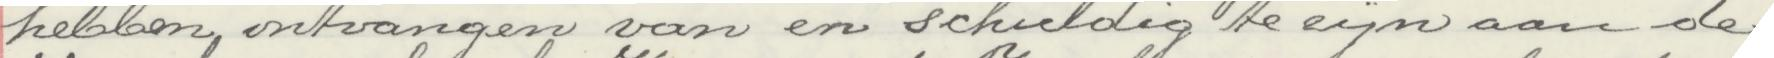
hebben ontvangen van en schudig te zijn aan de
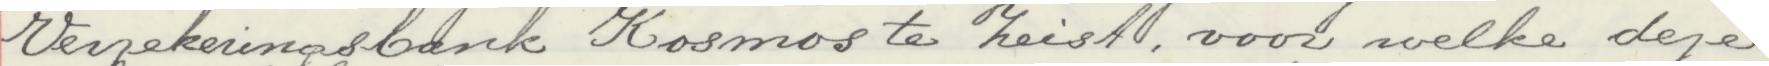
Verzekeringsbank Kosmos te Zeist, voor welke deze
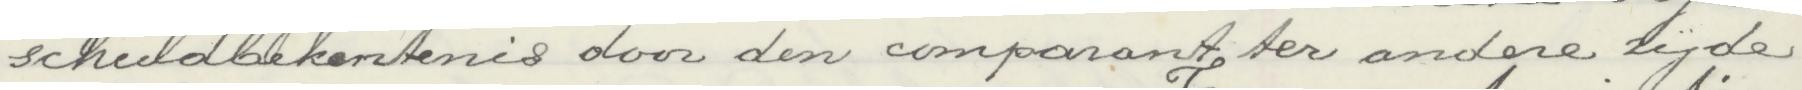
schuldbekentenis door den comparant ter andere zijde
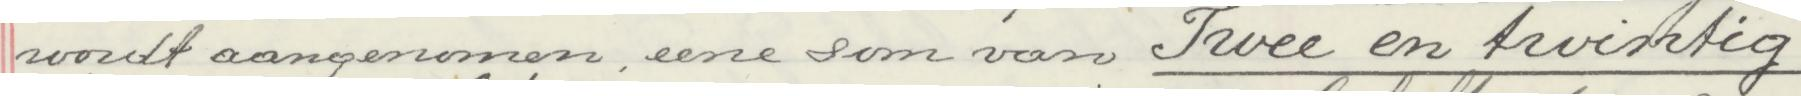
wordt aangenomen, eene som van Twee en twintig
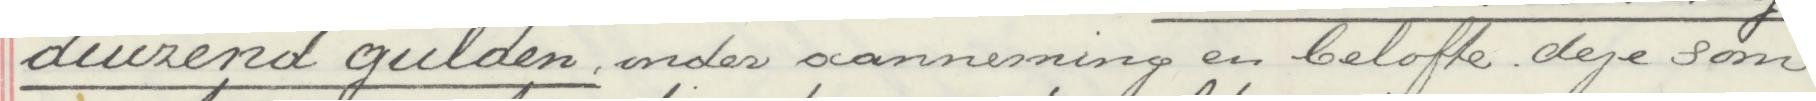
duizend gulden, onder aanneming en belofte, deze som
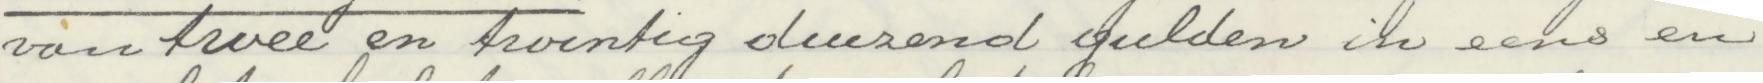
van twee en twintig duizend gulden in eens en
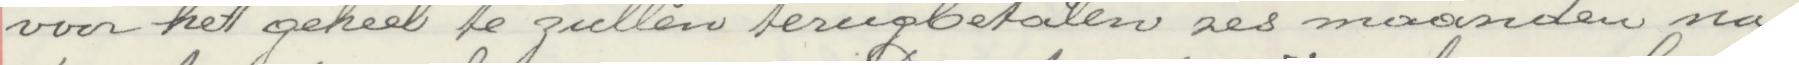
voor het geheel te zullen terugbetalen zes maanden na
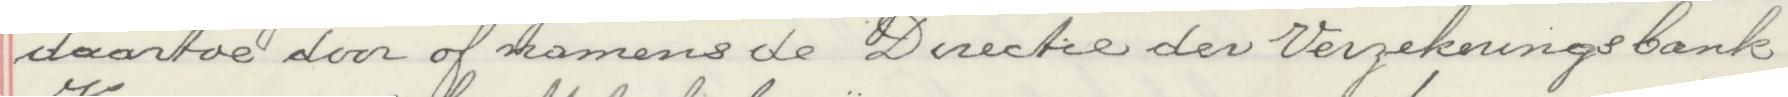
daartoe door of namens de Directie der Verzekerings bank
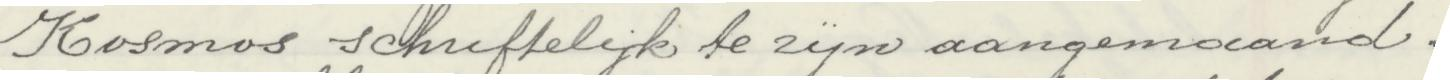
Kosmos schriftelijk te zijn aangemaand
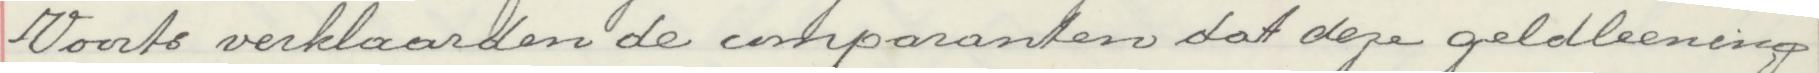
Voorts verklaarden de comparanten dat deze geldleening
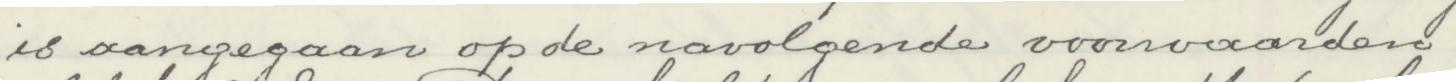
is aangegaan op de navolgende voorwaarden
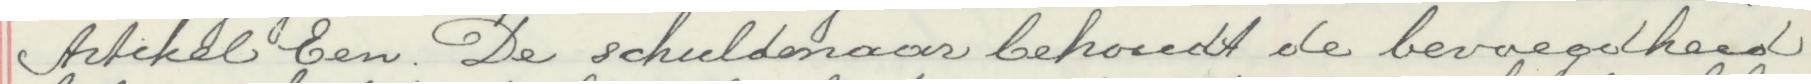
Artikel Een. De schuldenaar behoudt de bevoegdheid
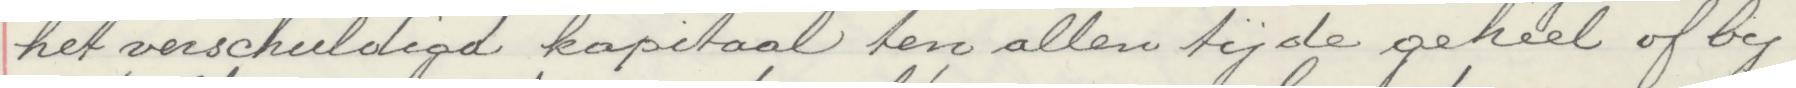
het verschuldigd kapitaal ten allen tijde geheel of bij
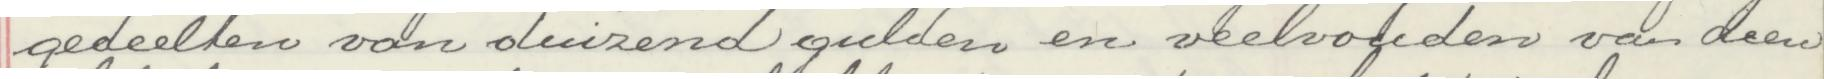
gedeelten van duizend gulden en veelvouden van dien
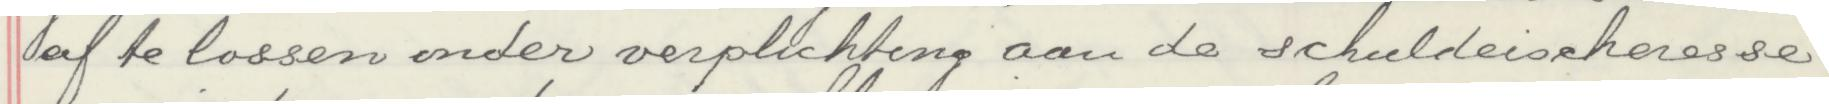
af te lossen onder verplichting aan de schuldeischeresse
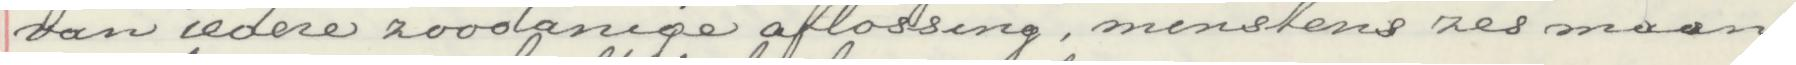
van iedere zoodanige aflossing, minstens zes maan
